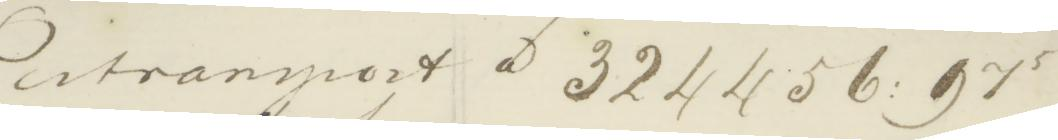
Per transport ƒ 324456: 975
